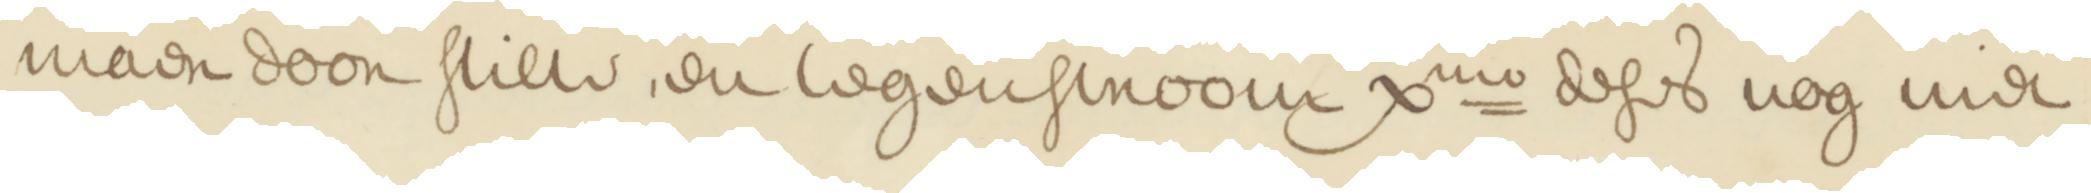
maer door stilte, en tegenstroom p=mo deses nog niet
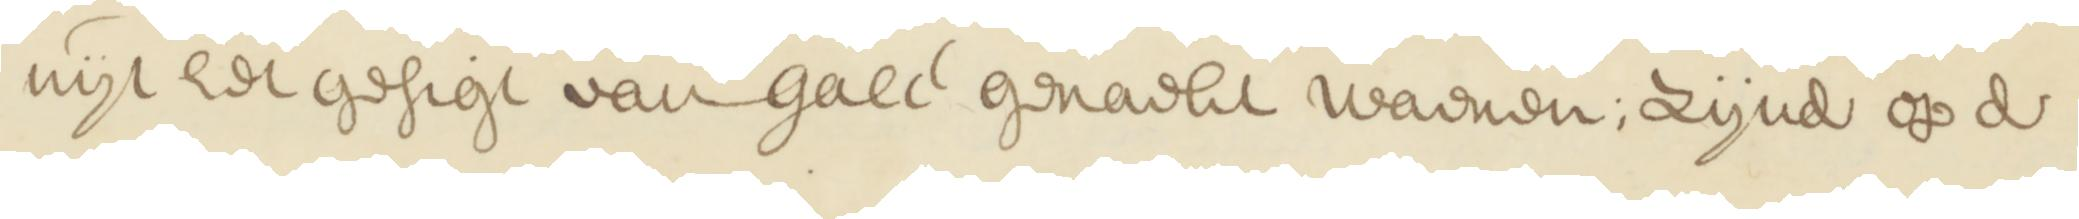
uijt het gesigt van gale geraekt waeren; zijnde op de
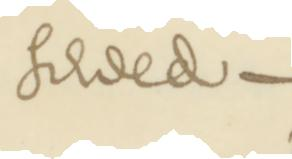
schelde —
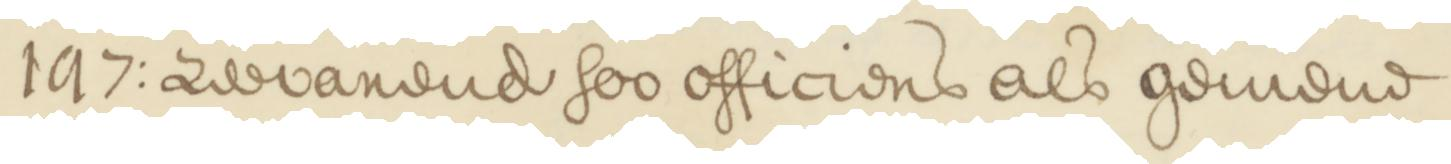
147: zeevarende soo officiers als gemene
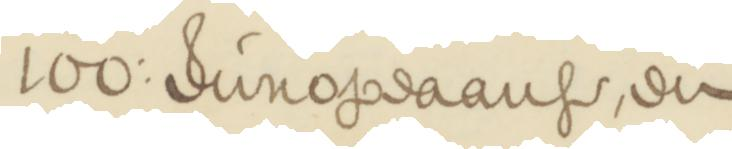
100: Europeaanse, en
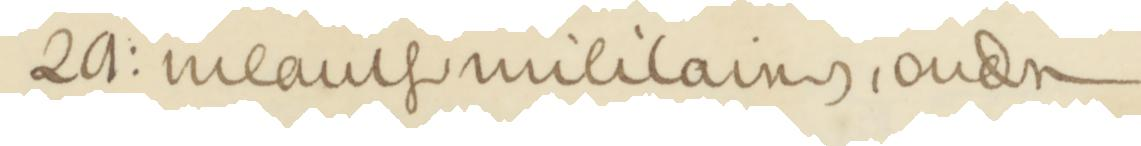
24: inlantse militairen, onder
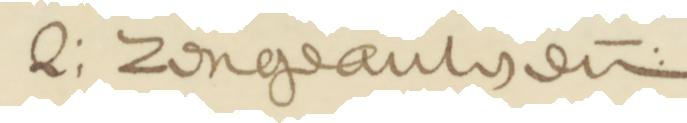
2: zergeanten en:
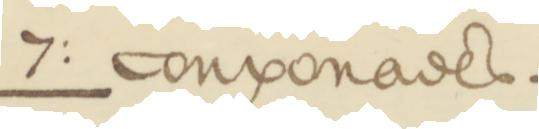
7: corporaels —
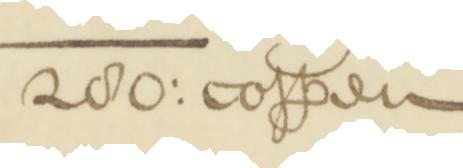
280: coppen
